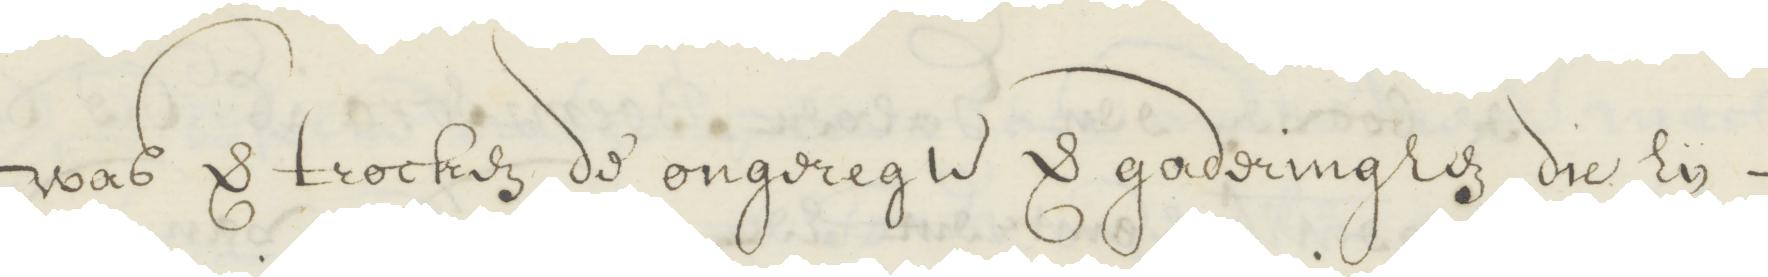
was vertrocken de ongeregte vergaderinghen, die hij
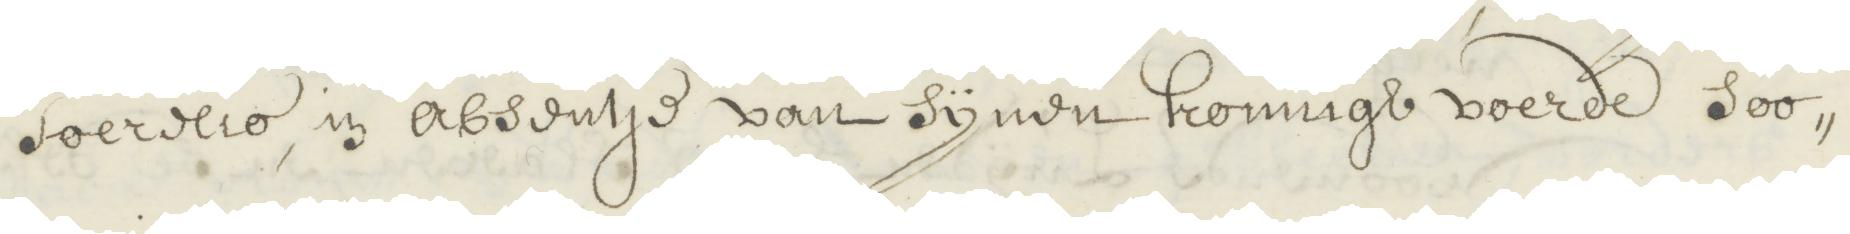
Toerelio, in absentje van sijnen koningh voerde soo„
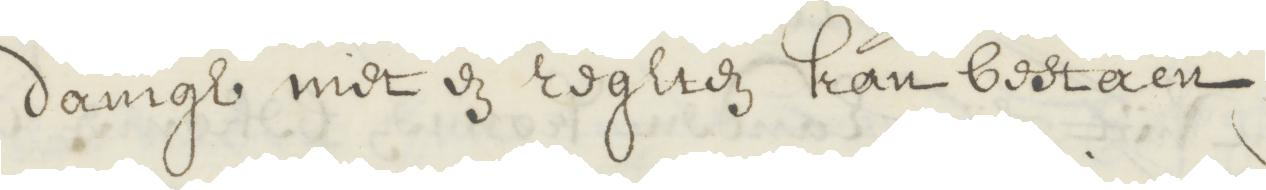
danigh niet en reghten kan bestaen
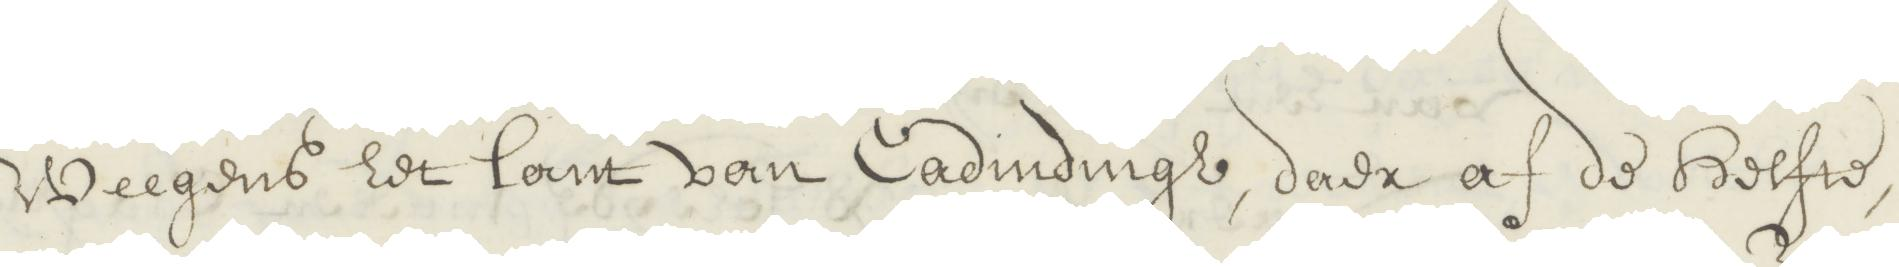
weegens het lant van Cadindingh, daer af de helfte,
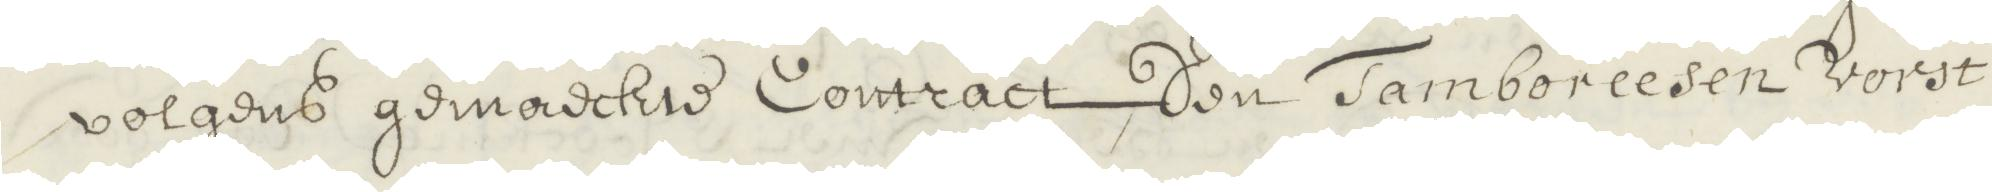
volgens gemaeckte Contract den Tamboreesen vorst
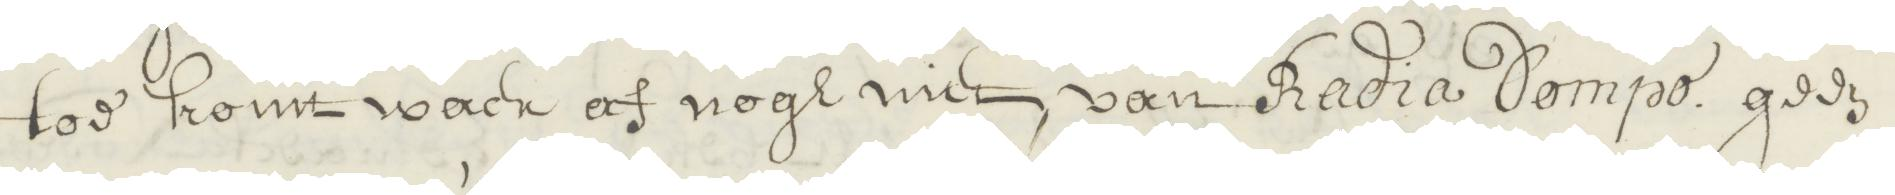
toe komt waer af nogh niet, van Radia dompo. geen
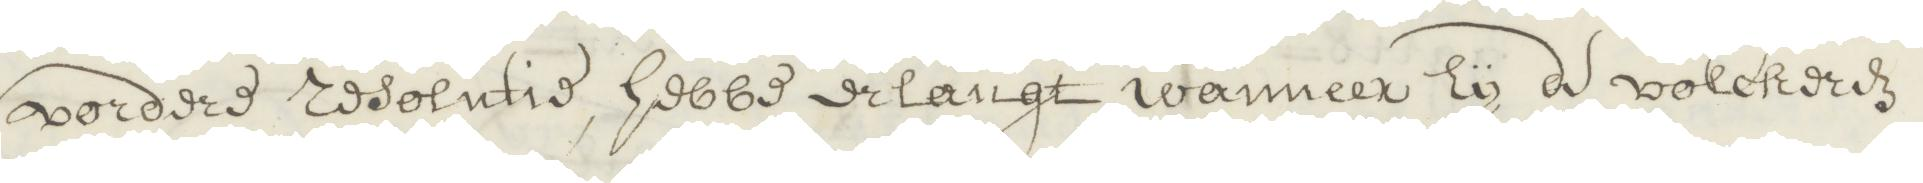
vordere resolutie, hebbe erlangt, wanneer hij de volckeren
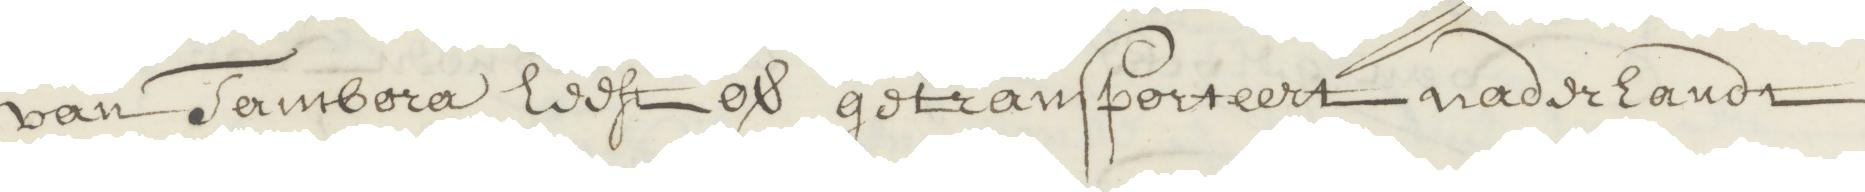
van Tambora heeft over getransporteert naderhandt
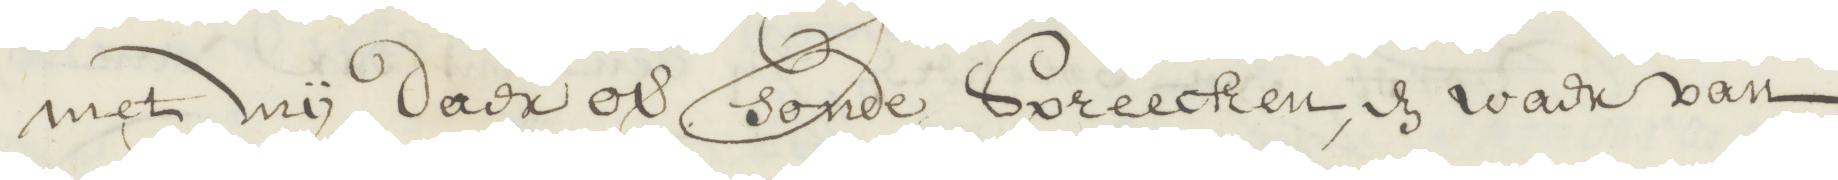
met mij, daer over soude spreecken, en waer van
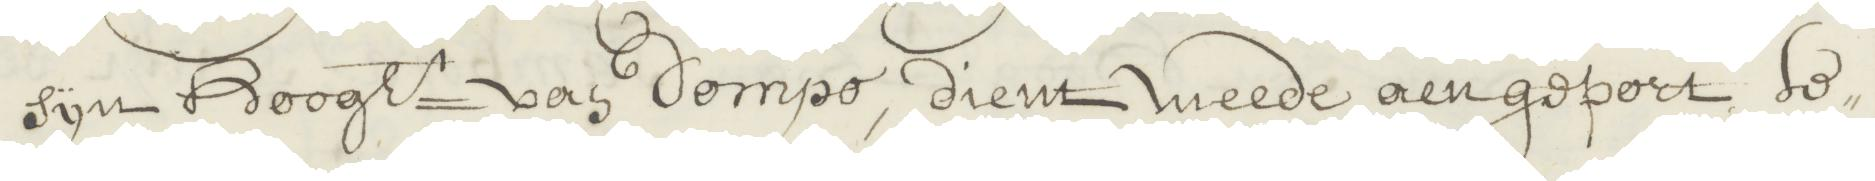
sijn Hoogh=t van dompo, dient meede aengeport te„
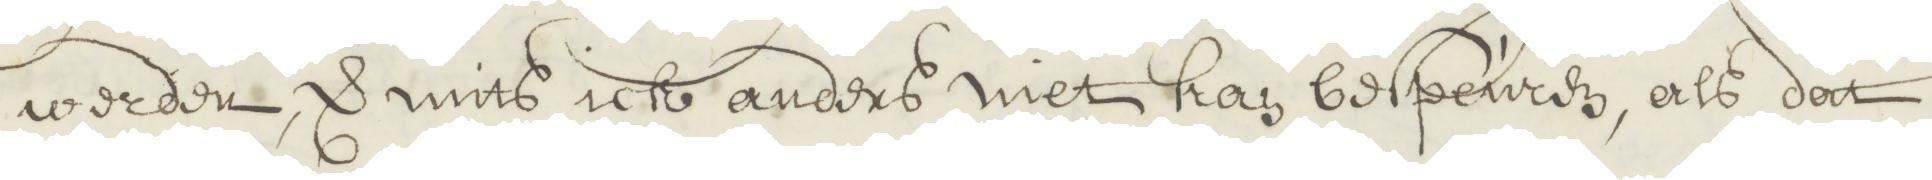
werden, vermits ick anders niet kan bespeuren, als dat
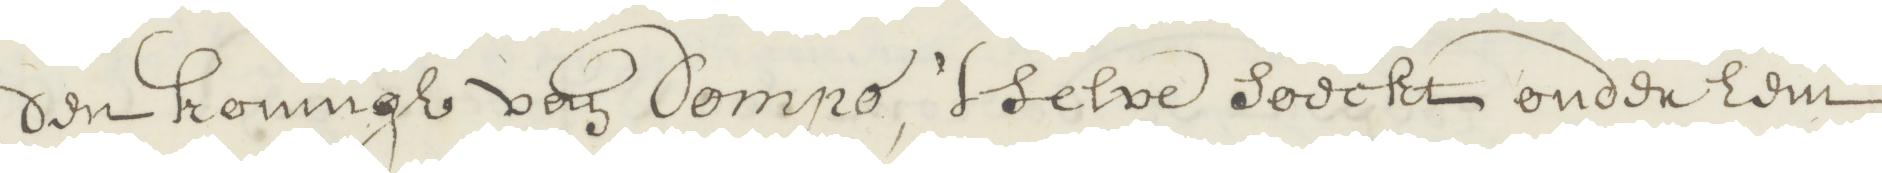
den koningh van dompo, 'tselve soeckt onder hem
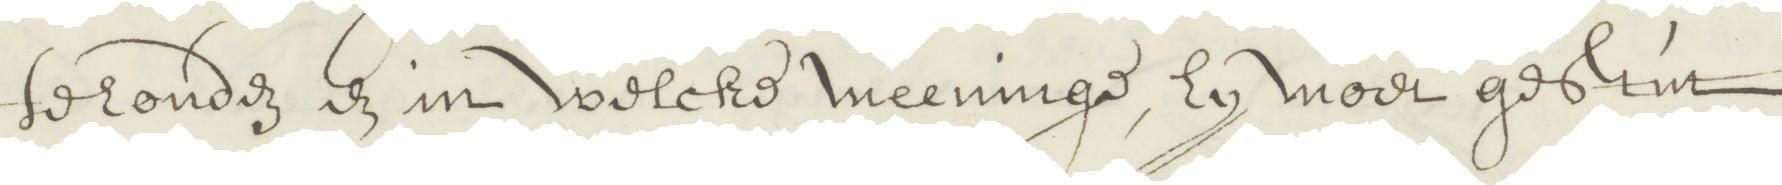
tehouden en in welcke meeninge, hy moet gestut
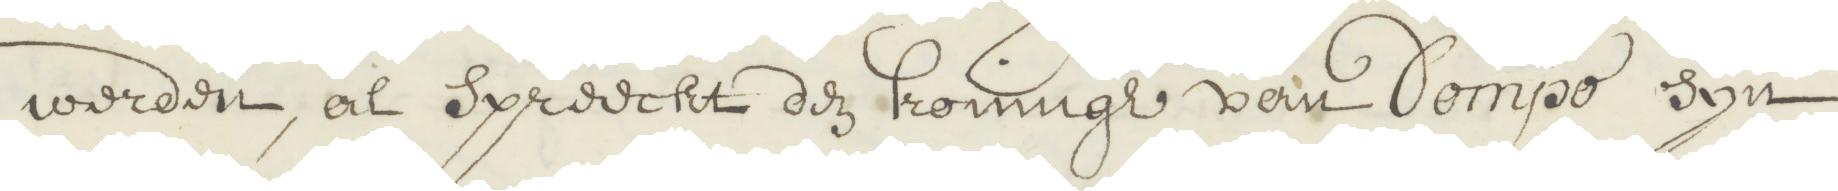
werden, al spreeckt den koningh van dompo syn
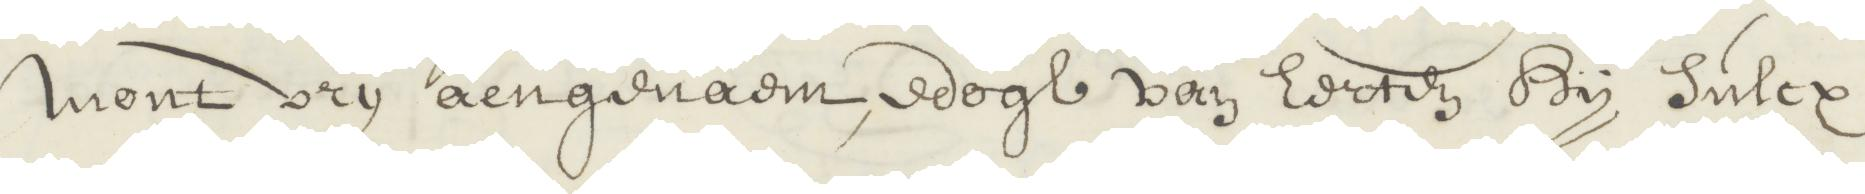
mont vrij aengenaem, edogh van herten hij sulcx
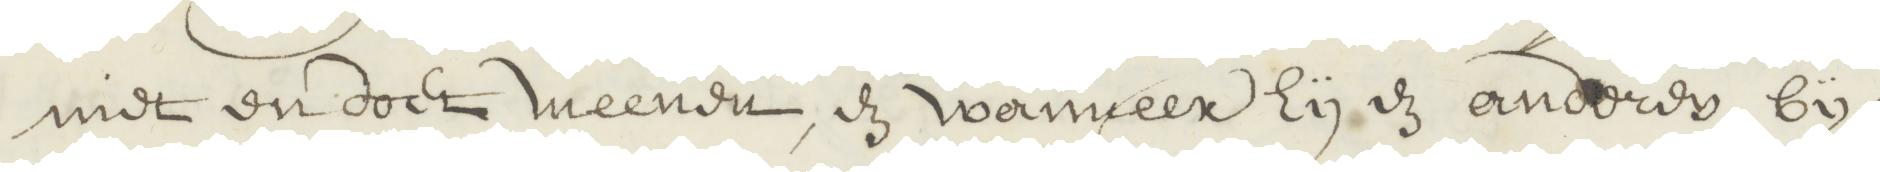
niet en doet meenen, en wanneer hij en anderen, bij
